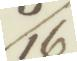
5/16
